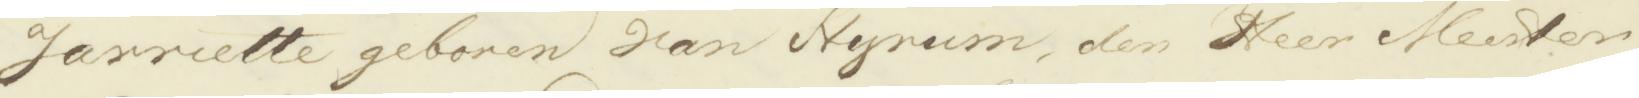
Jarriette geboren van Styrum, den Heer Meester
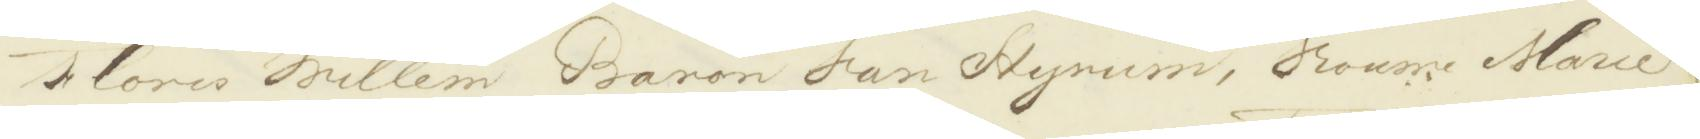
Floris Willem Baron van Styrum, Vrouwe Marie
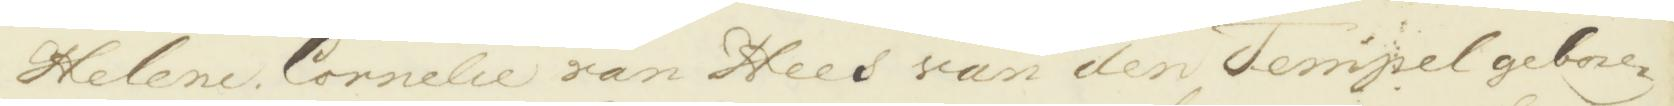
Helene Cornelie van Hees van den Tempel geboren
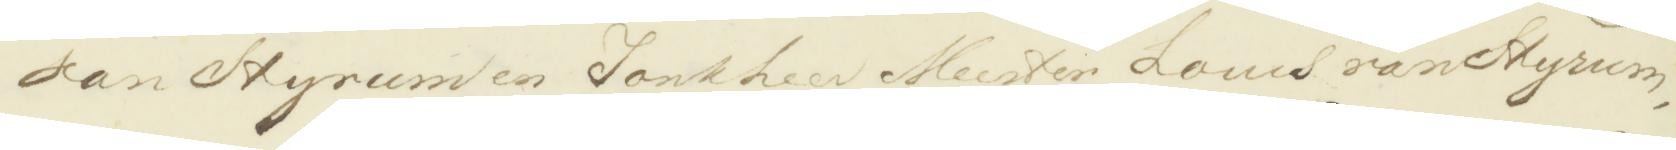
van Styrum en Ionkheer Meester Louis van Styrum,
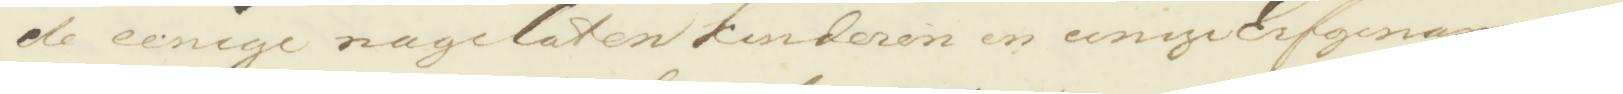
de eenige nagelaten kinderen en eenige Erfgenamen
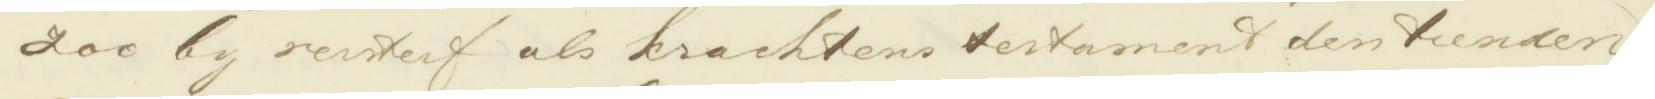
zoo bij versterf als krachtens testament den tienden
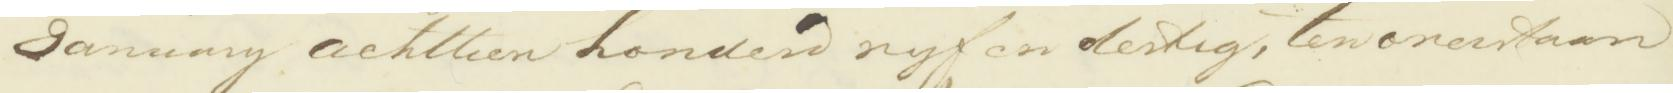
January achttien honderd vyf en dertig, ten overstaan
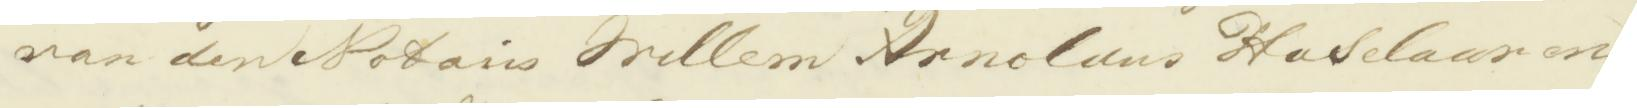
van den Notaris Willem Arnoldus Haselaar en
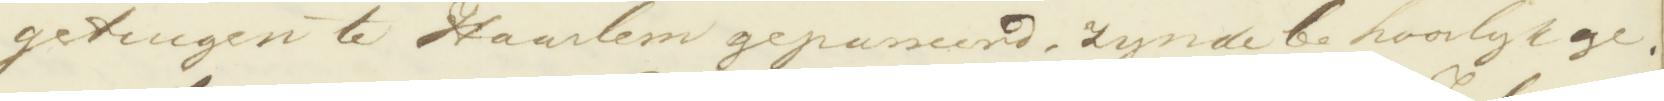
getuigen te Haarlem gepasseerd, zynde behoorlyk ge„
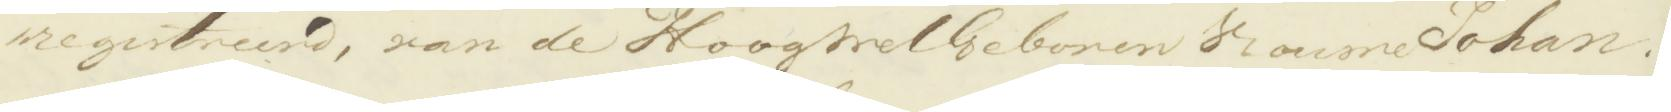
„registreerd, van de HoogwelGeboren Vrouwe Iohan,
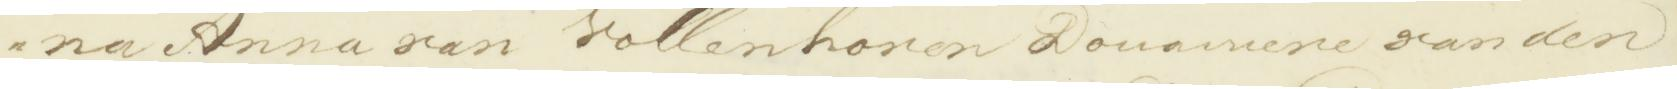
„na Anna van Vollenhoven Douariere van den
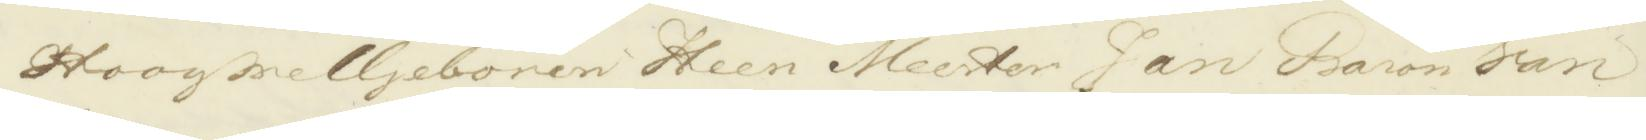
HoogwelGeboren Heer Meester Jan Baron van
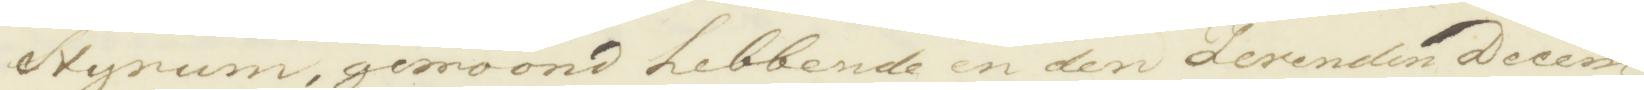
Styrum, gewoond hebbende en den Zevenden Decem
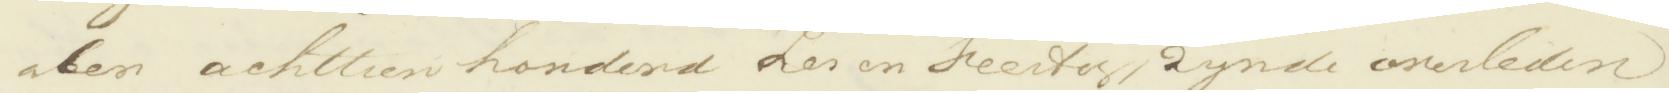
ber achttien honderd Zes en veertig, zynde overleden
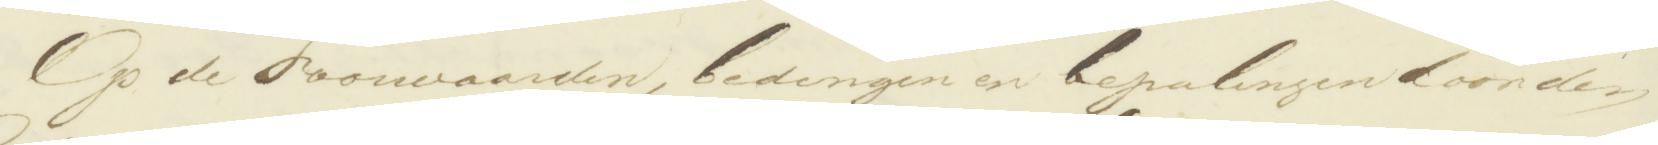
Op de voorwaarden, bedingen en bepalingen door den
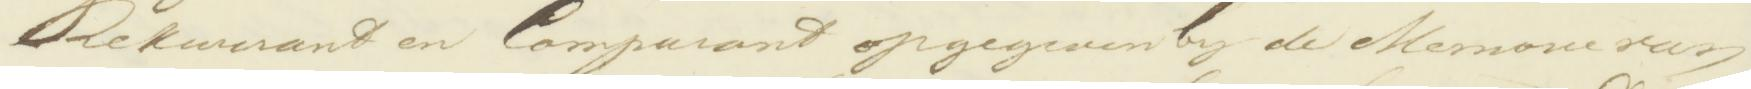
Rekwirant en Comparant opgegeven by de Memorie van
